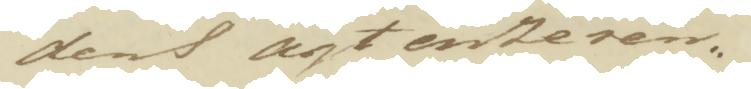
dens agt en zeven„
